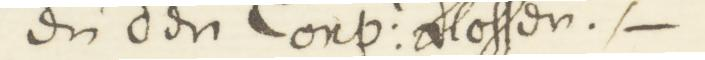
en den Corp:l verlossen. / —
